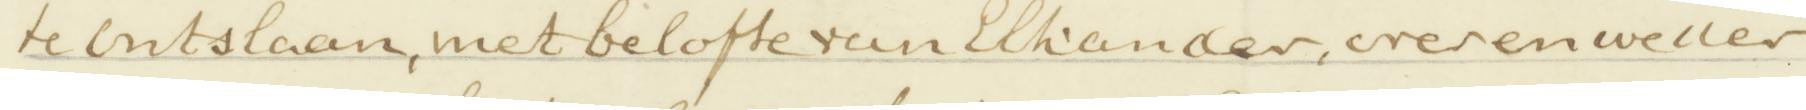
te ontslaan, met belofte van Elkander over en weder
